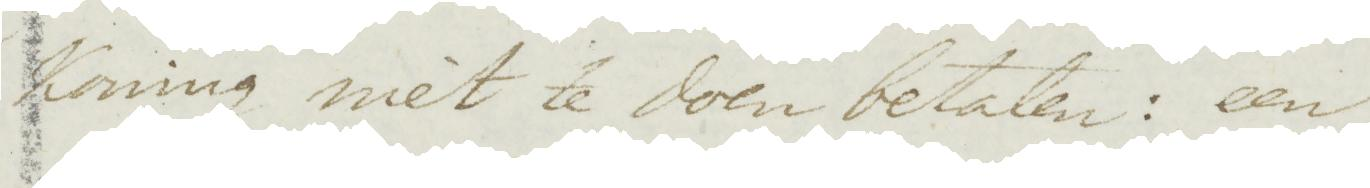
koning niet te doen betalen: een
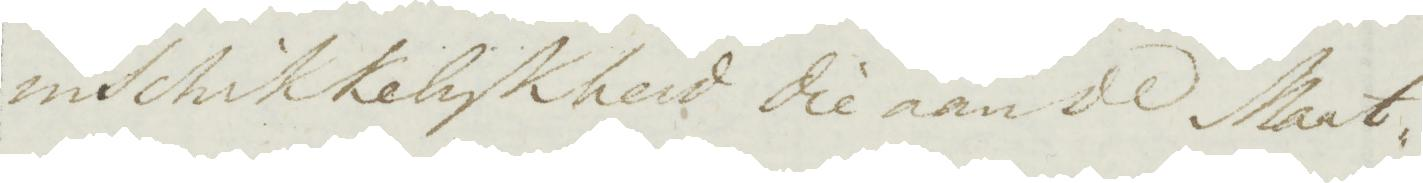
inschikkelijkheid die aan de Maat„
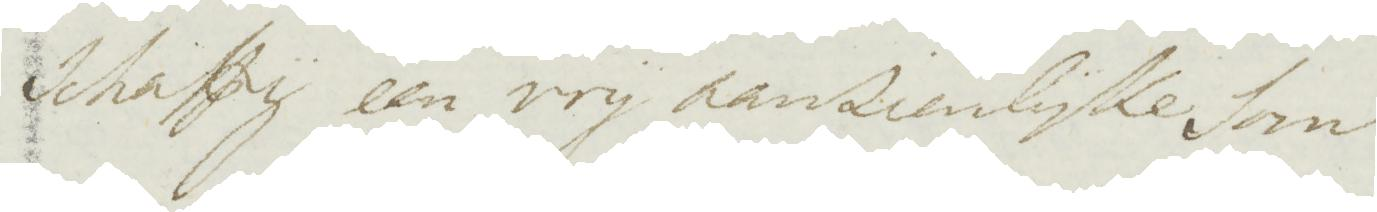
schappij een vrij aanzienlijke som
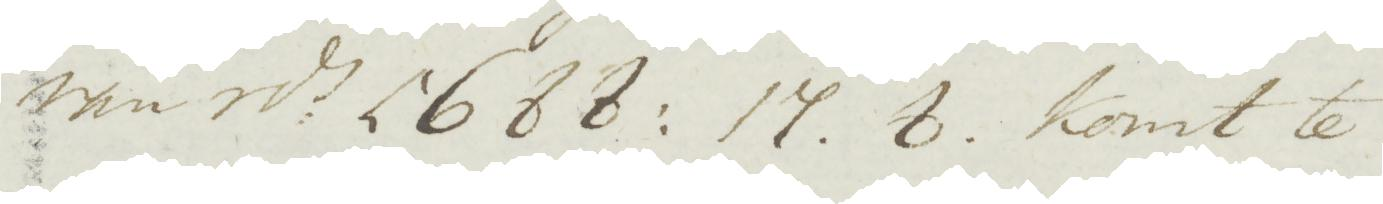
van rd:s 5688: 17. 8. komt te
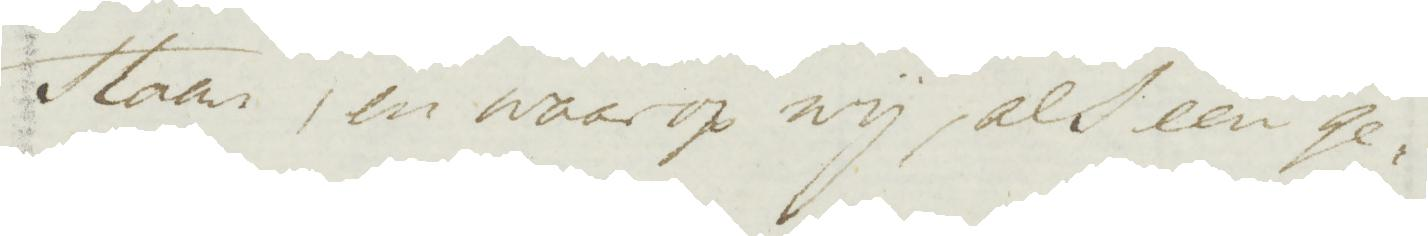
staan, en waar op wij, als een ge„
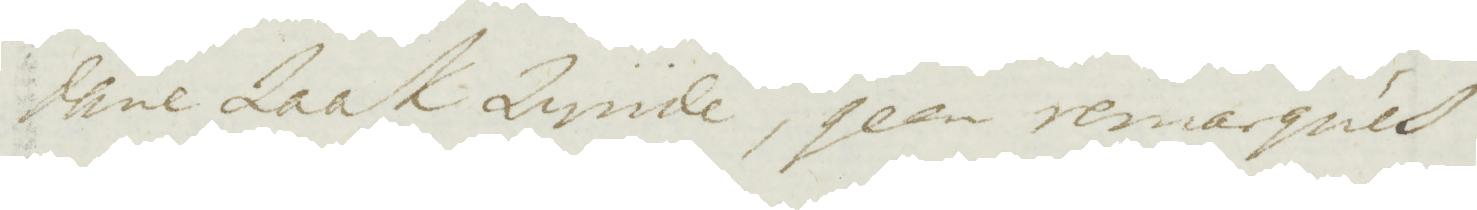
dane zaak zijnde, geen remarques
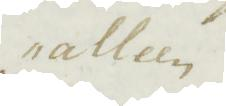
„alleen
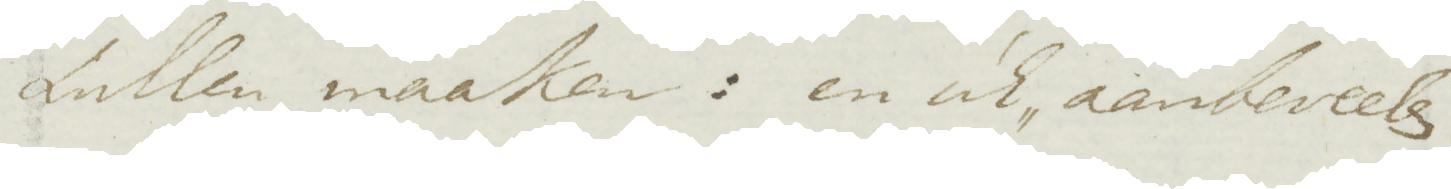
zullen maaken: en uE„ aanbeveelen
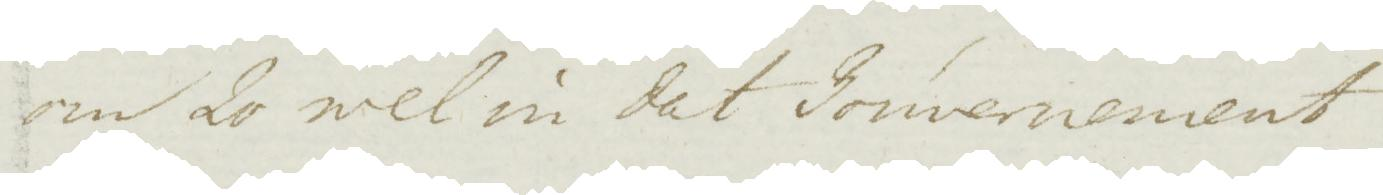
om zo wel in dat Gouvernement
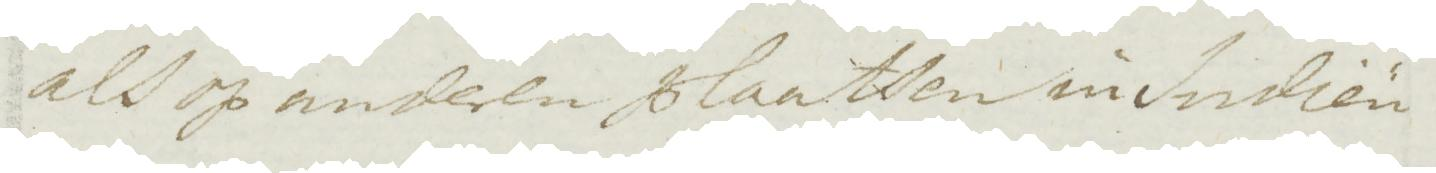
als op anderen plaatsen in Indiën
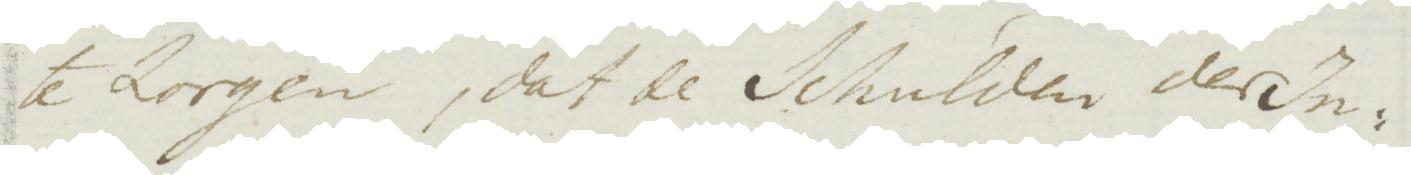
te zorgen, dat de schulden der In„
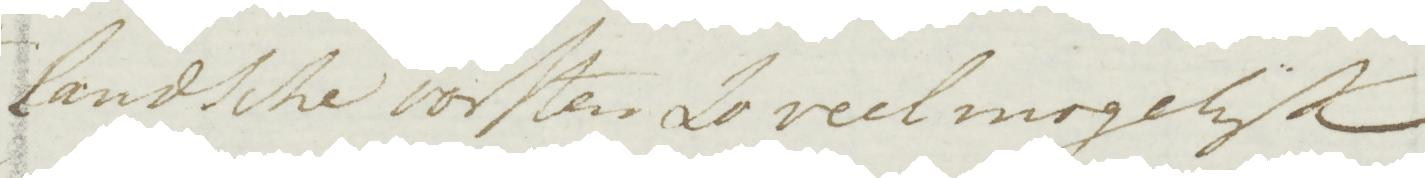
landsche vorsten zo veel mogelijk
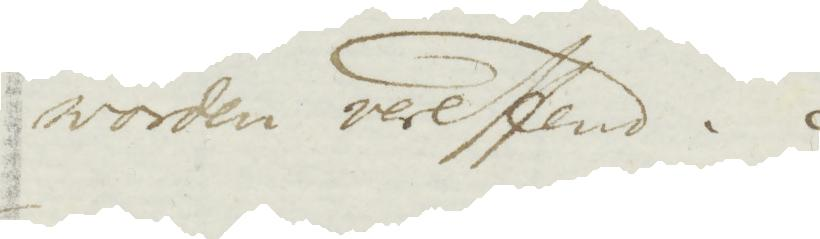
worden vereffend.
